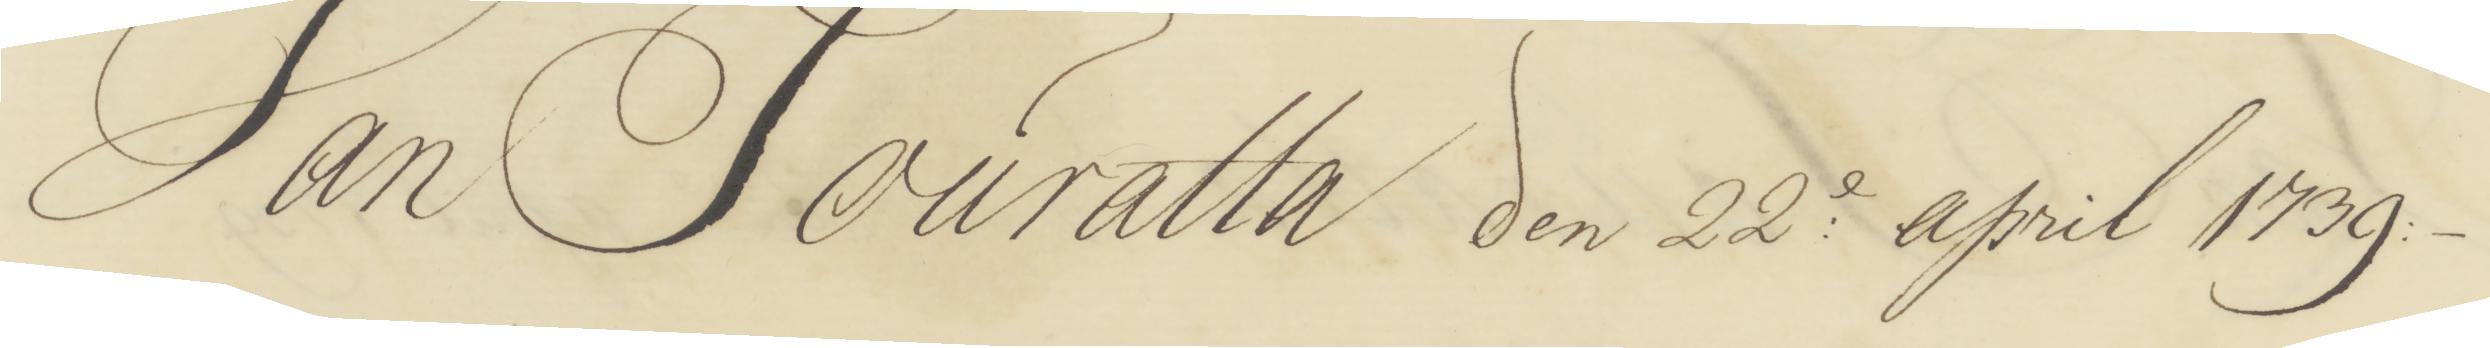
Van Souratta den 22:e april 1739: —
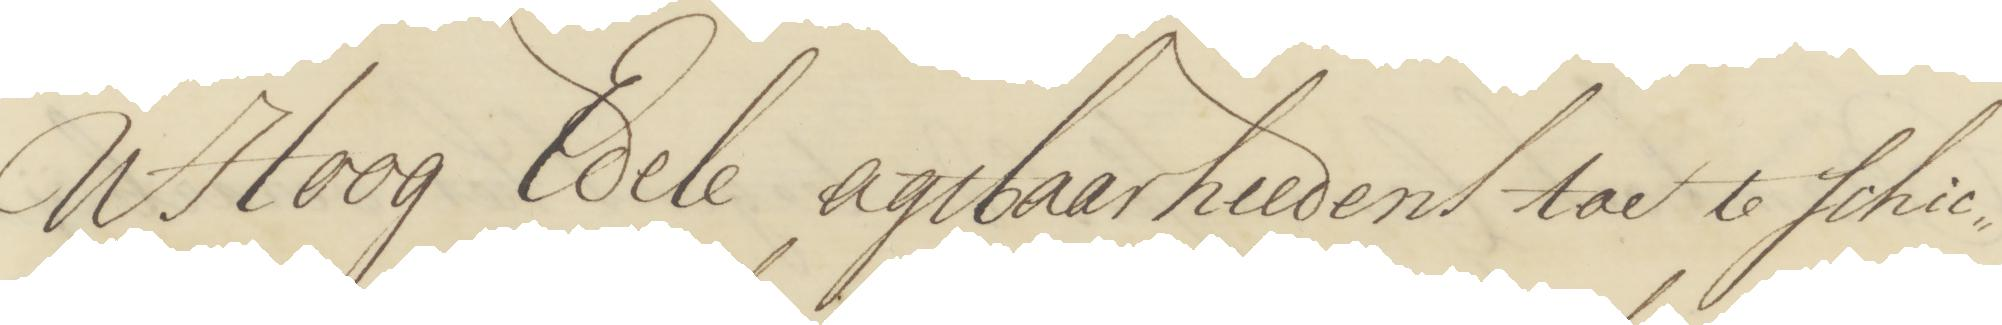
U Hoog Edele agtbaarheedens toe te schic„
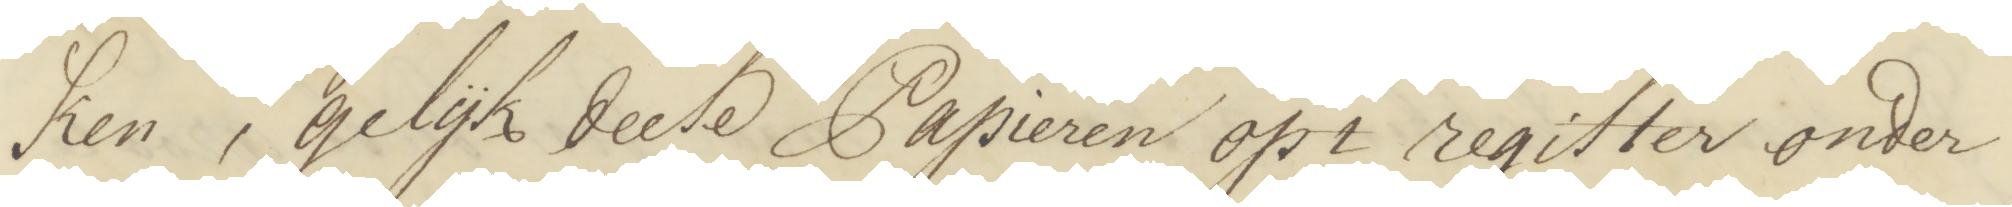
ken, gelijk deese Papieren op ’t register onder
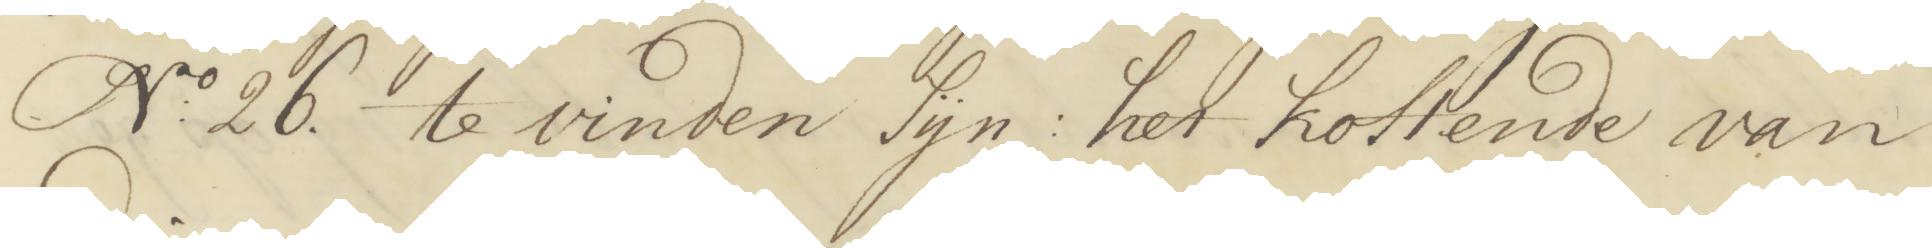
N:o 26. te vinden sijn: het kostende van
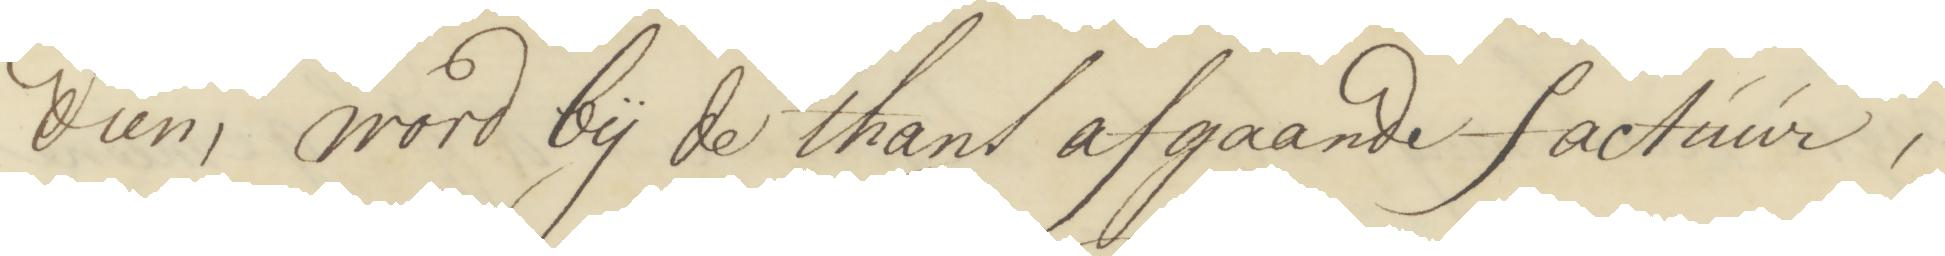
dien, word bij de thans afgaande factuur,
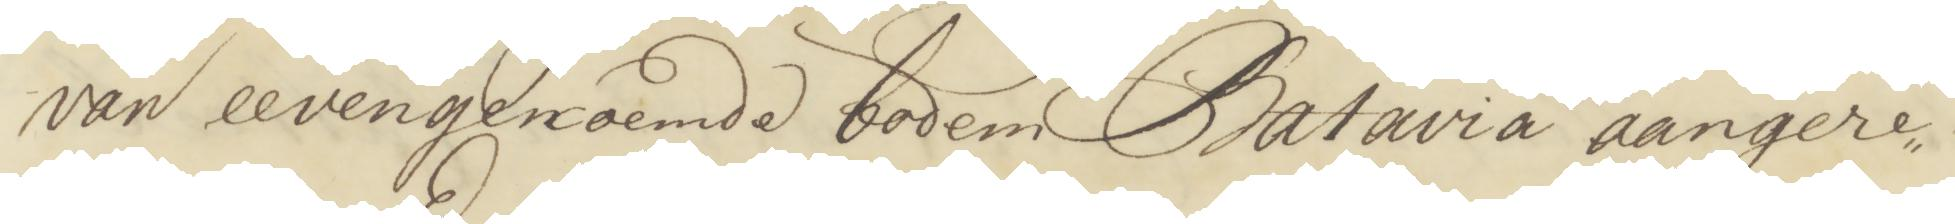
van eevengenoemde bodem Batavia aangere„
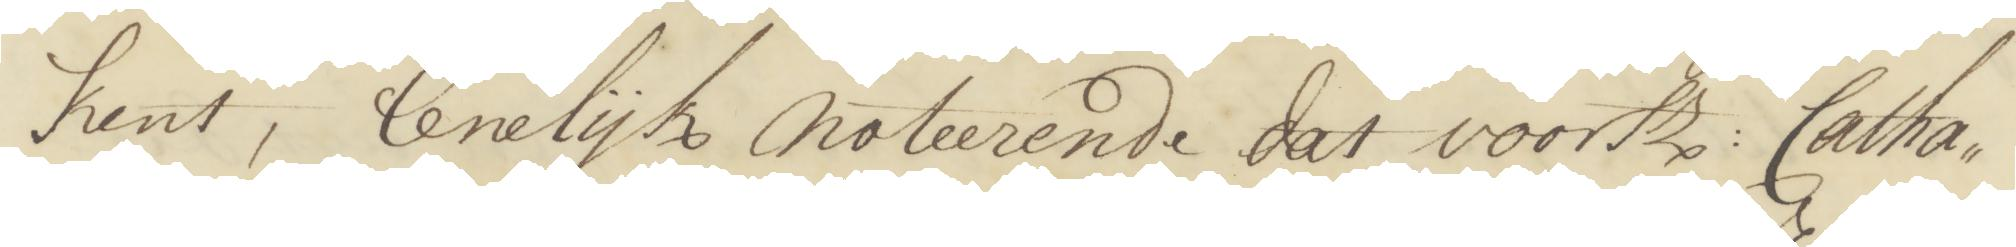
kent, Eenelijk Noteerende dat voorsz: Catha„
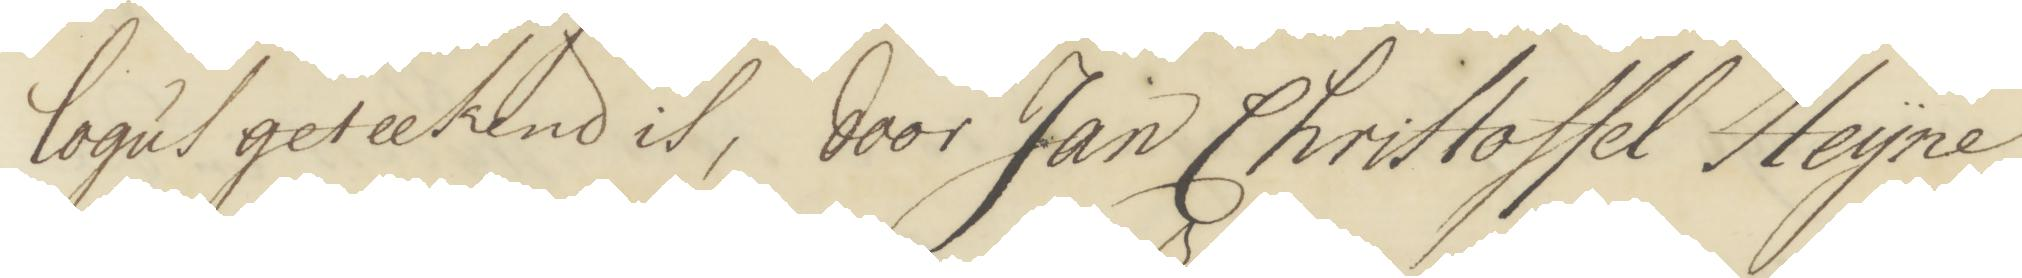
logus geteekend is, door Jan Christoffel Heijne,
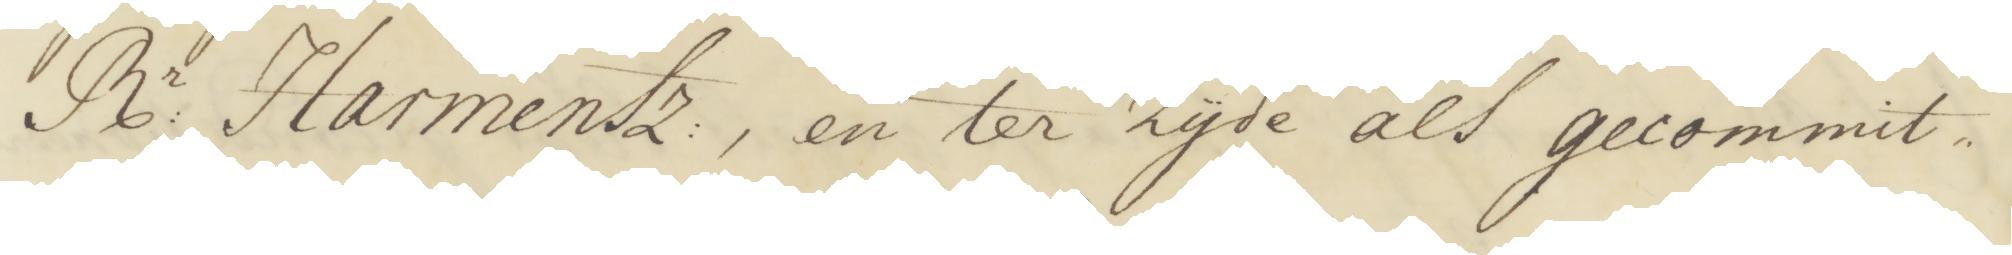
R:r Harmensz:, en ter zijde als gecommit„
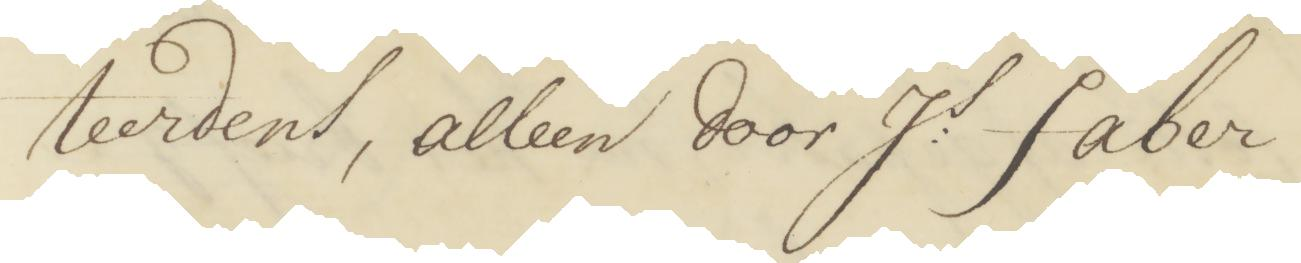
teerdens, alleen door J:s Faber
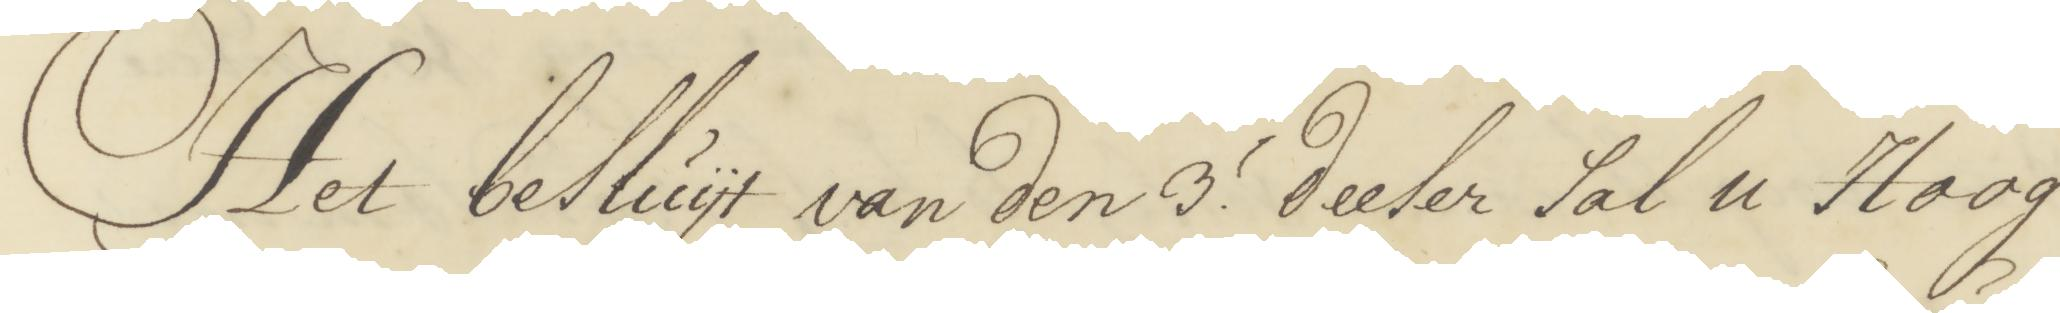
Het besluijt van den 3.' deeser sal u Hoog
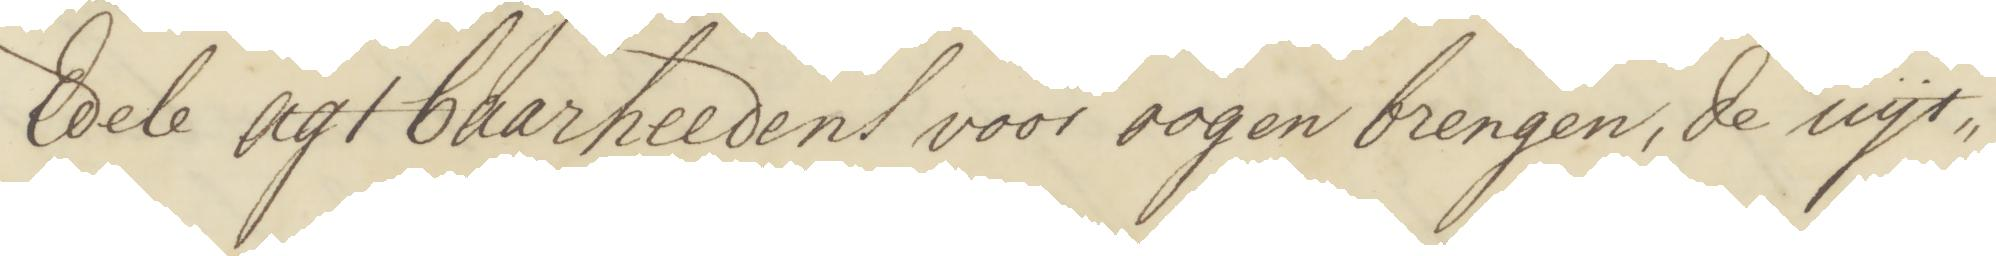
Edele agtbaarheedens voor oogen brengen, de uijt„
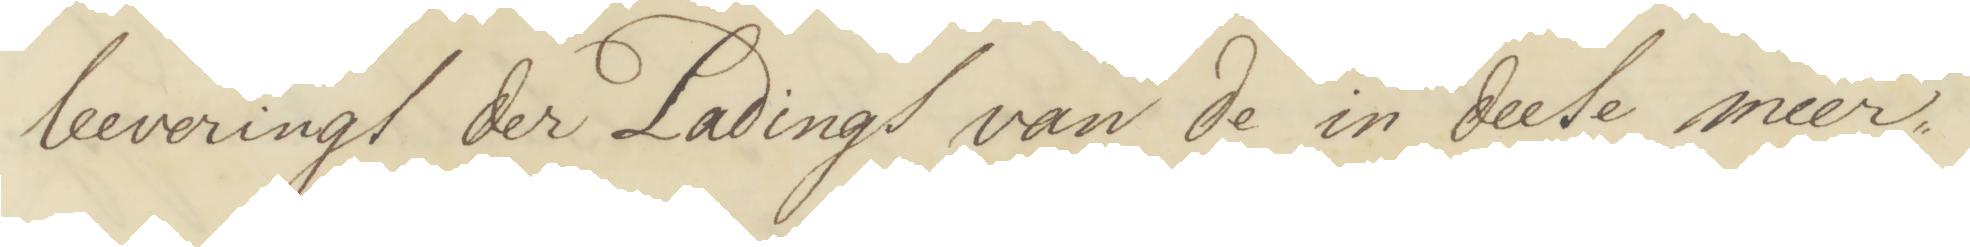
leeverings der Ladings van de in deese meer„
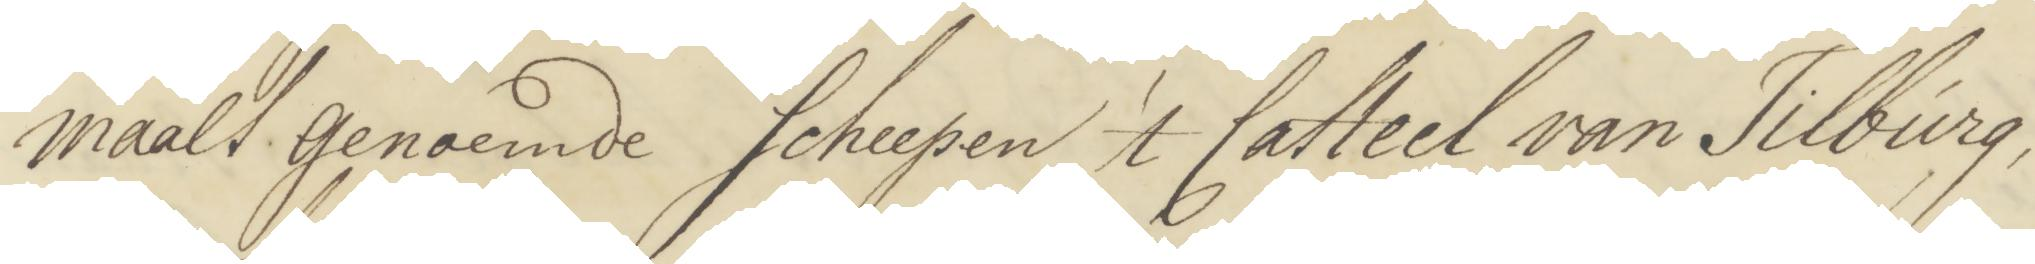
maals genoemde scheepen ’t Casteel van Tilburg,
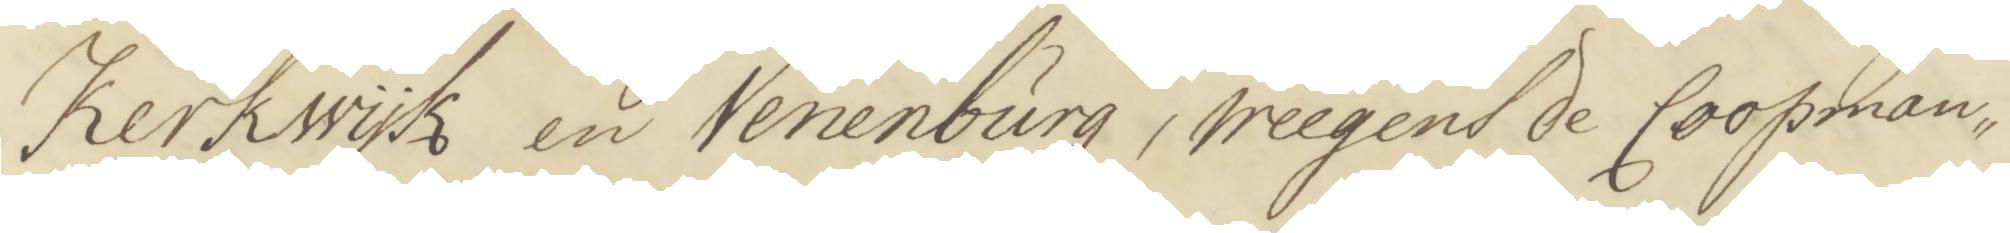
Kerkwijk en Venenburg, weegens de Coopman„
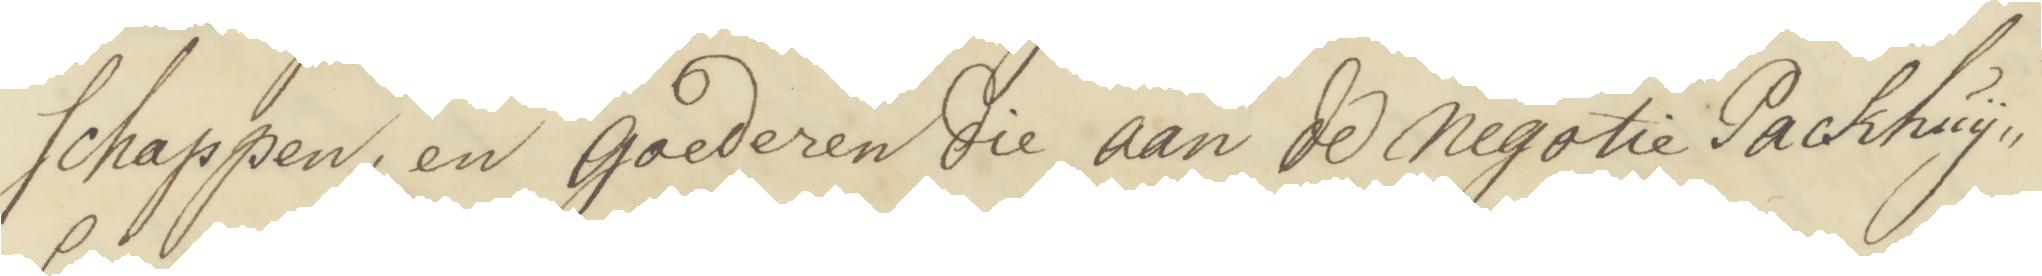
schappen, en Goederen die aan de negotie Packhuij„
